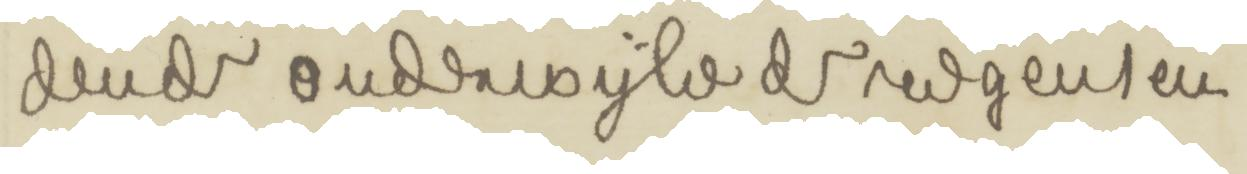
dende onderwijle de regenten
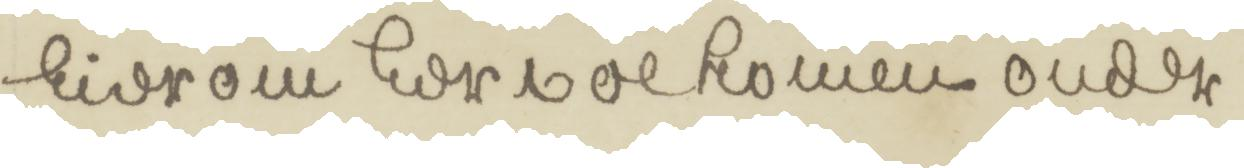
hier om her volkomen onder
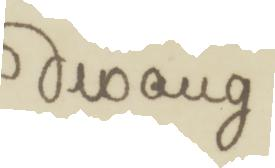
dwang
